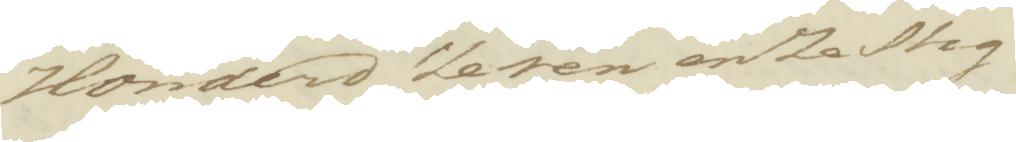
Honderd Zeven en Zestig
